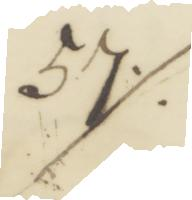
57./.
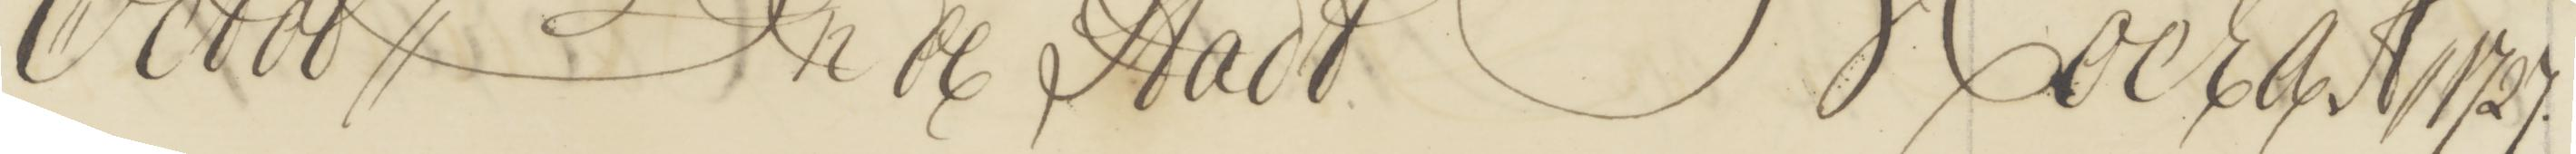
Octob„r In de Stadt Mocha A„o 1727.
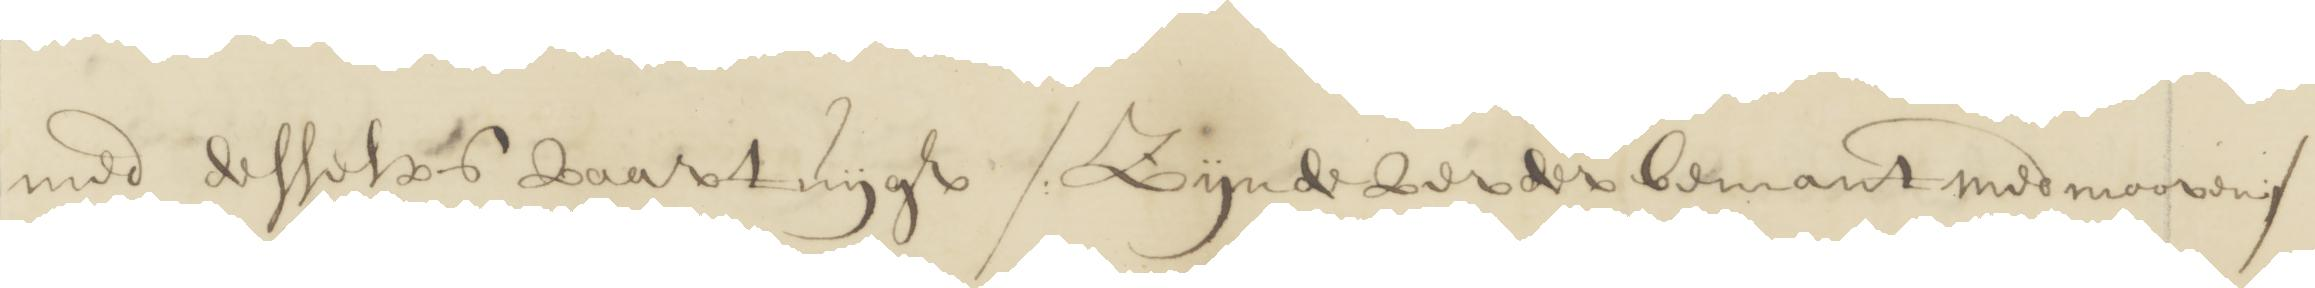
med desselvs vaartuijgh /: zijn de verder bemant med mooren:/
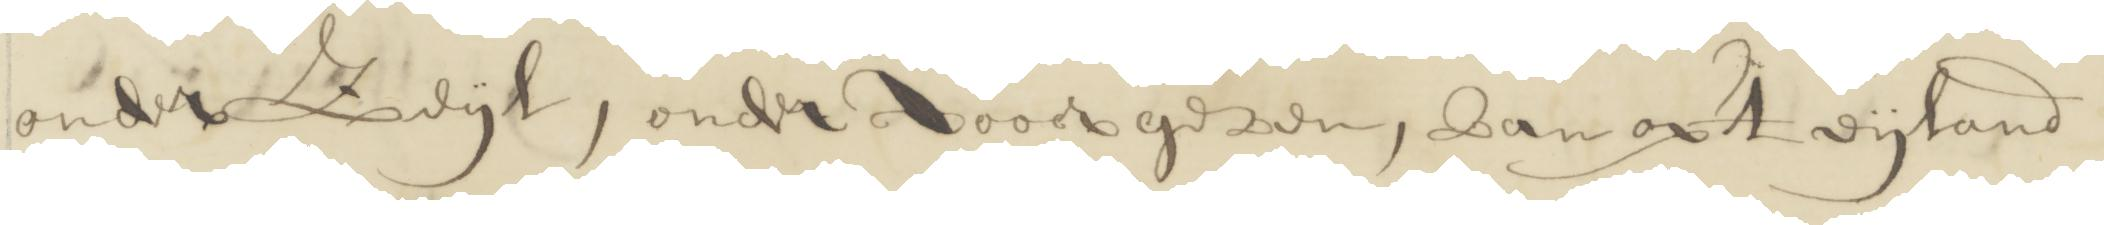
onder zeijl, onder voor geven, van op ’t eijland
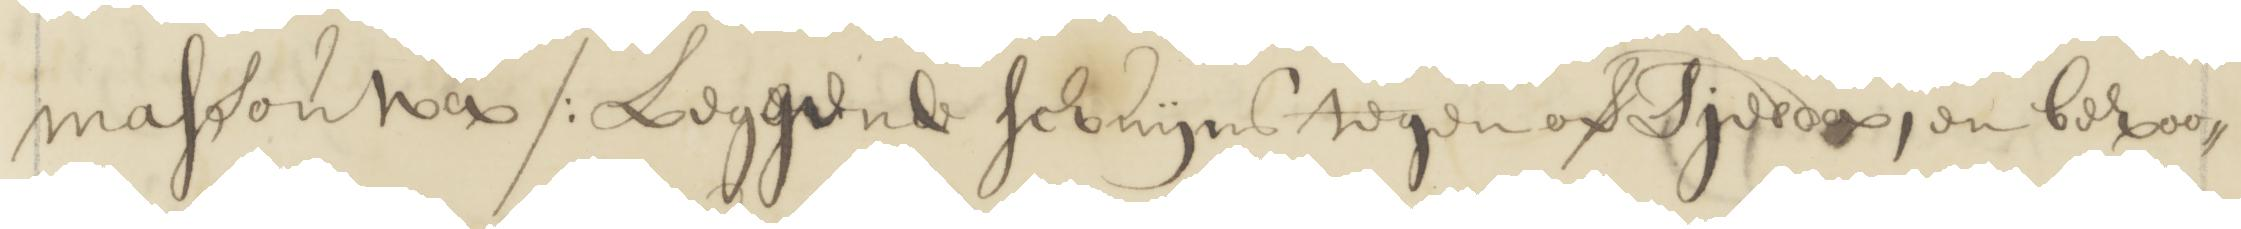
massouwa /: Leggende schuijns tegen over sjedda, en behoo„
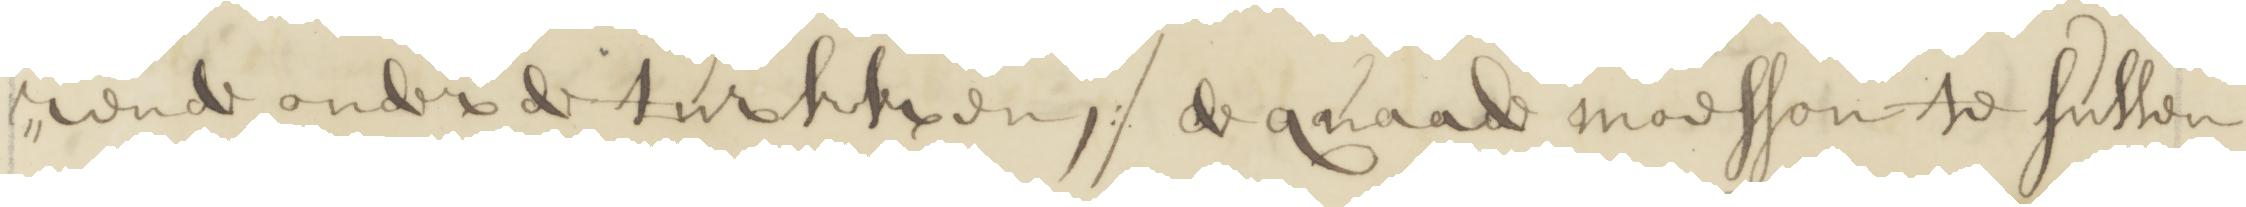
„rende onder de turkken, :/ de quaade moesson te sullen
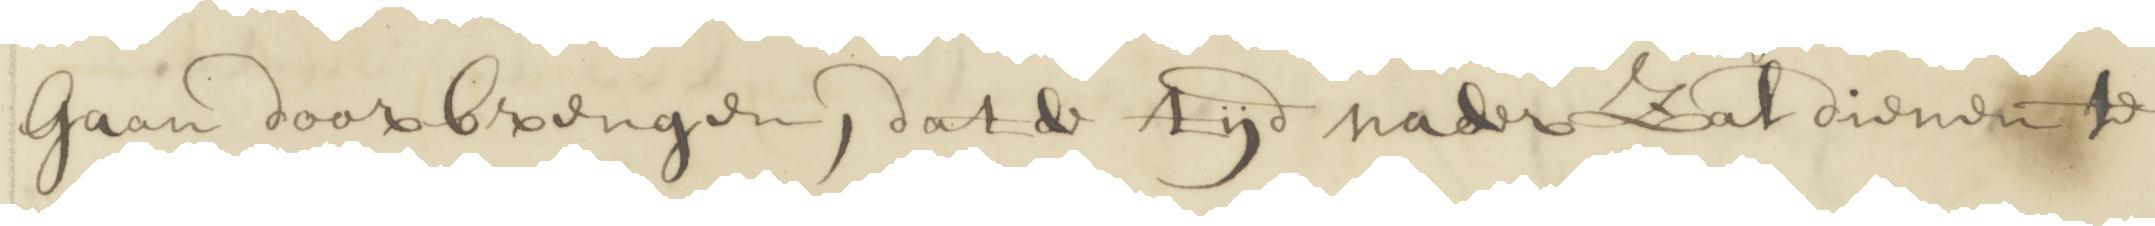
gaan door brengen, dat de tijd nader zal dienen te
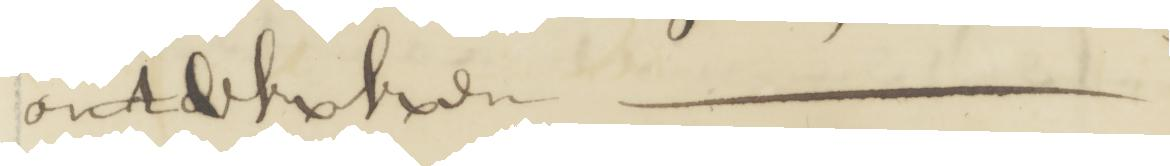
ontdekken —
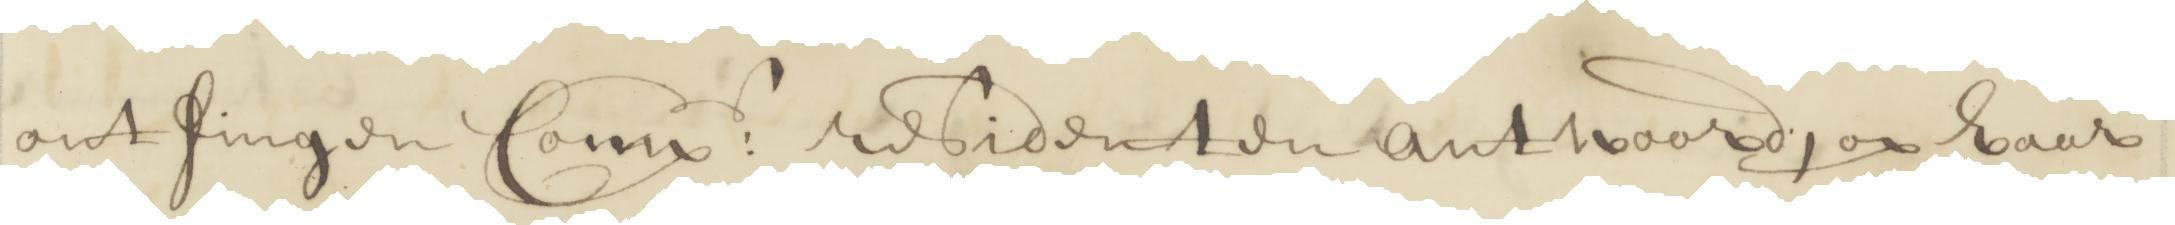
ontfingen Comp:s residenten antwoord, op haar
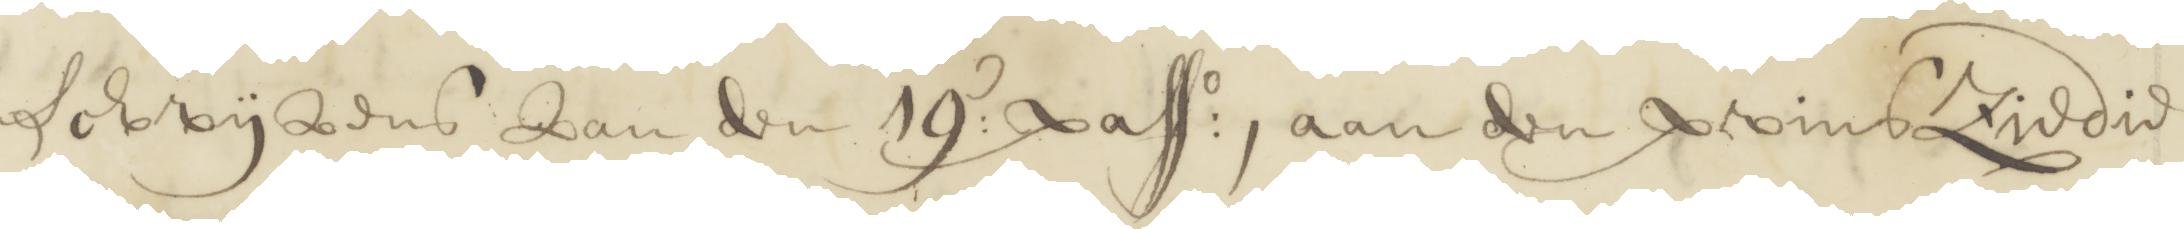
schrijvens van den 19:' pass:o, aan den prins ziedie
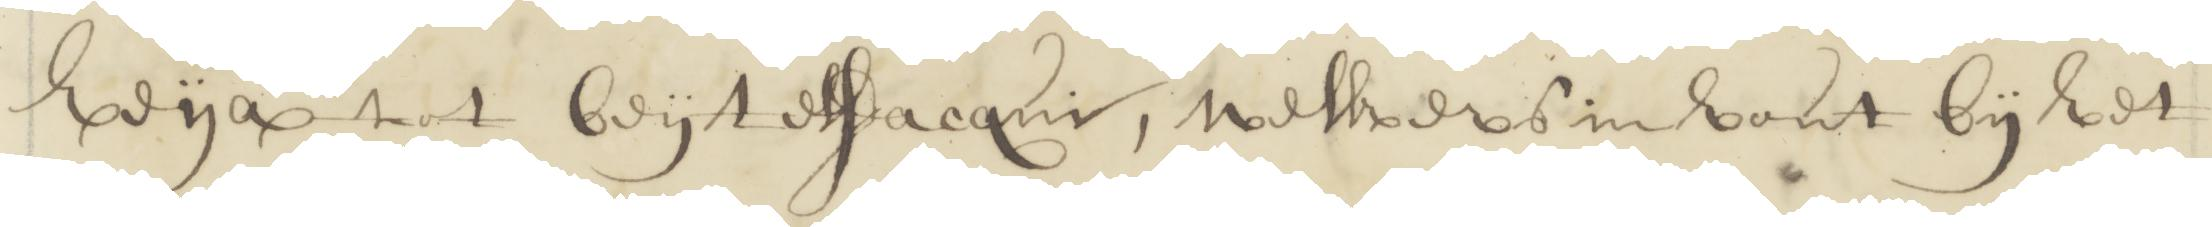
heija tot beijt elsacqui, welkers in hout bij het
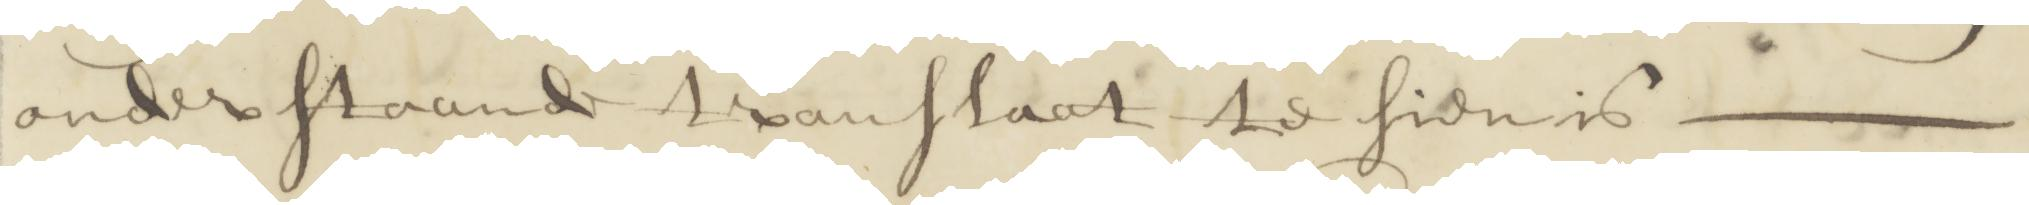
onderstaande translaat te sien is —
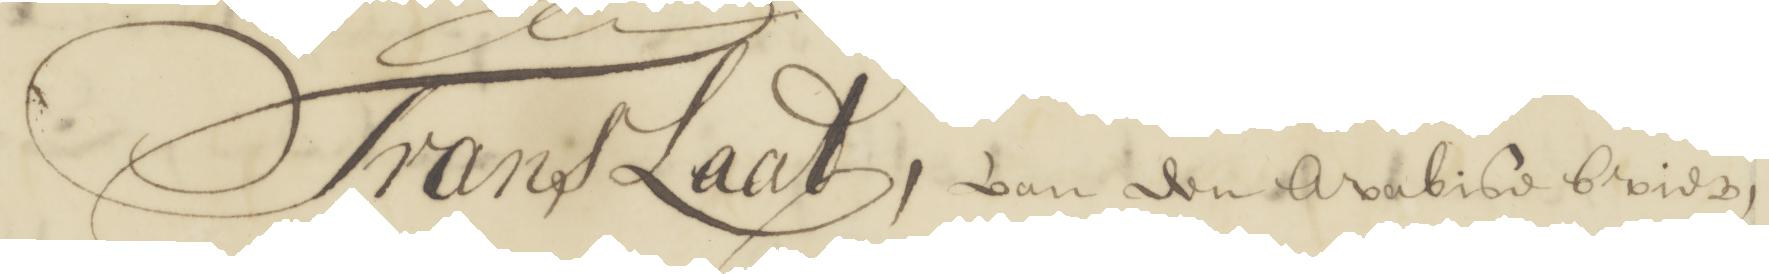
Translaat, van een arabise briev,
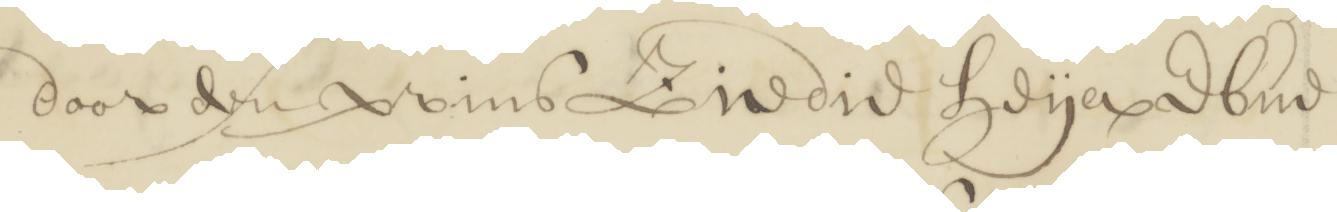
door den prins ziedie heija Ebue
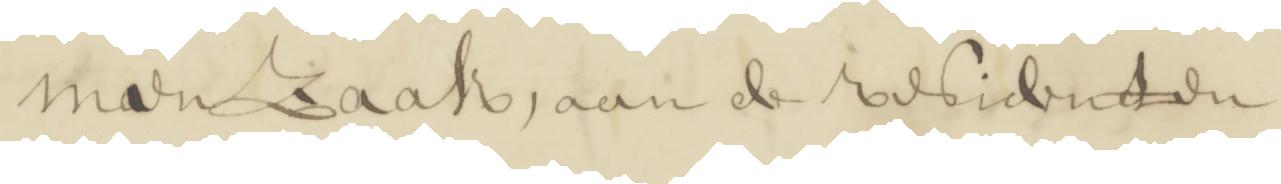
menzaak, aan de residenten
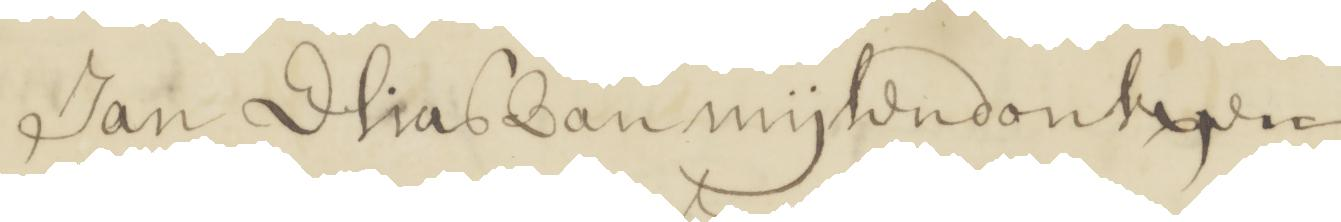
Ian Elias van mijlendonk, en
